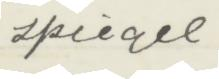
spiegel
